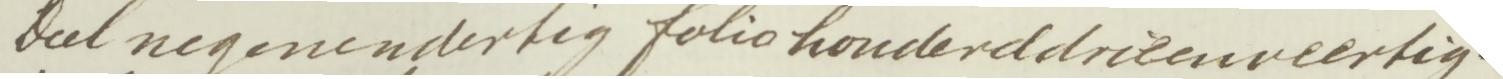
deel negen en dertig folio honderd drieenveertig.
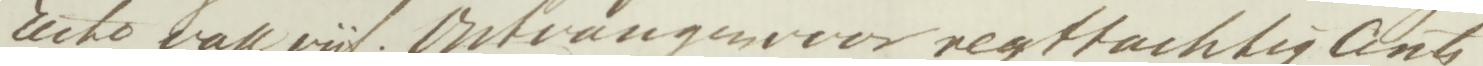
recto vak vijf. Ontvangen voor regt tachtig Cents
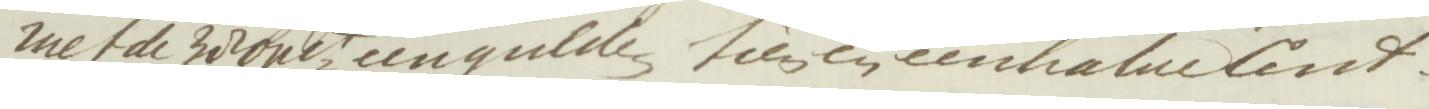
met de 38 opc„t een gulden tien en een halve Cent
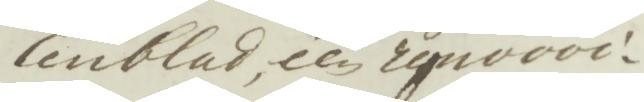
Een blad, één renvooi;
